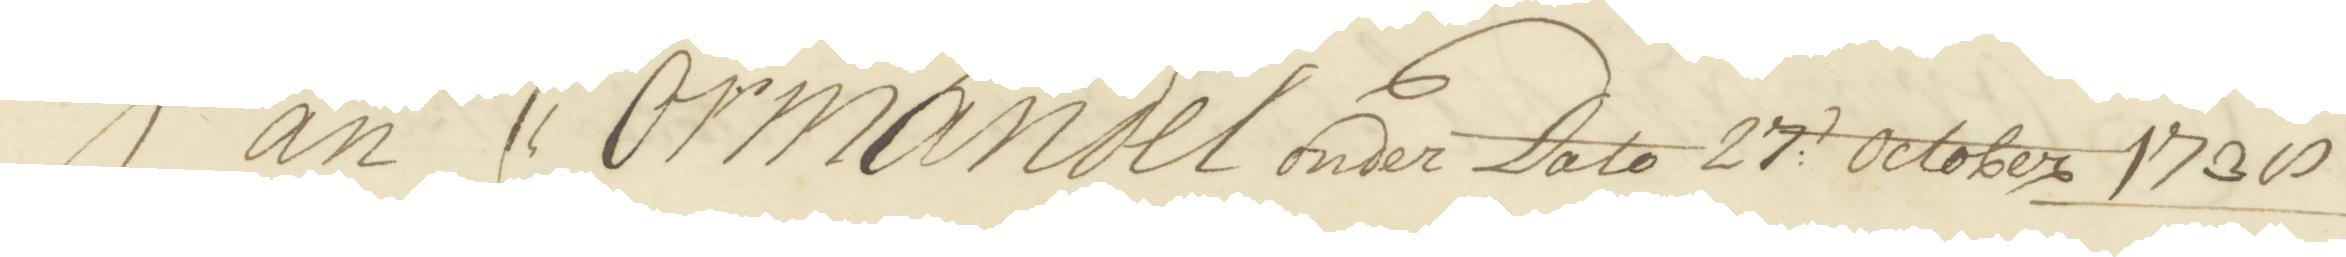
Van Cormandel onder Dato 27:' october 1738
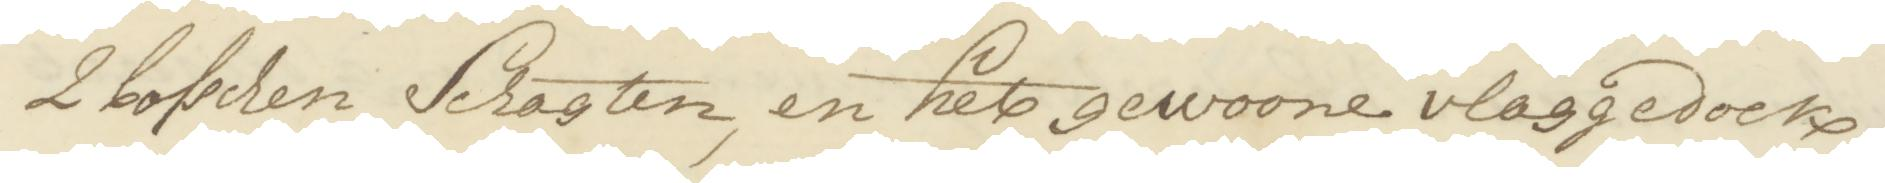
2 bosschen Schagten, en het gewoone vlaggedoek,
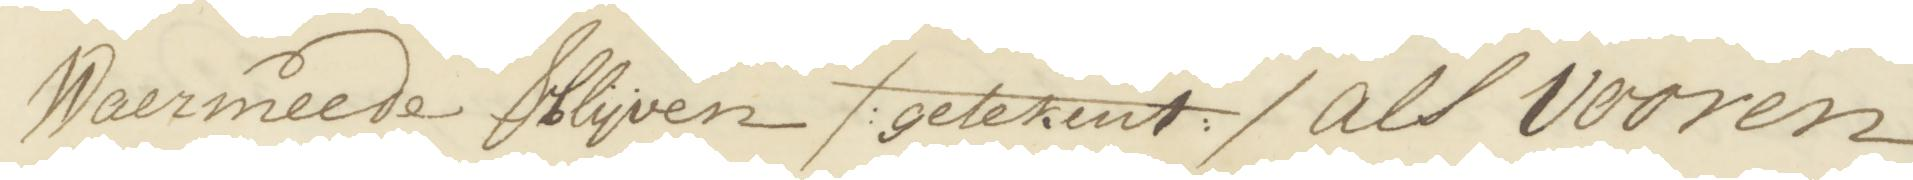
Waermeede verblijven /:getekent:/ als vooren
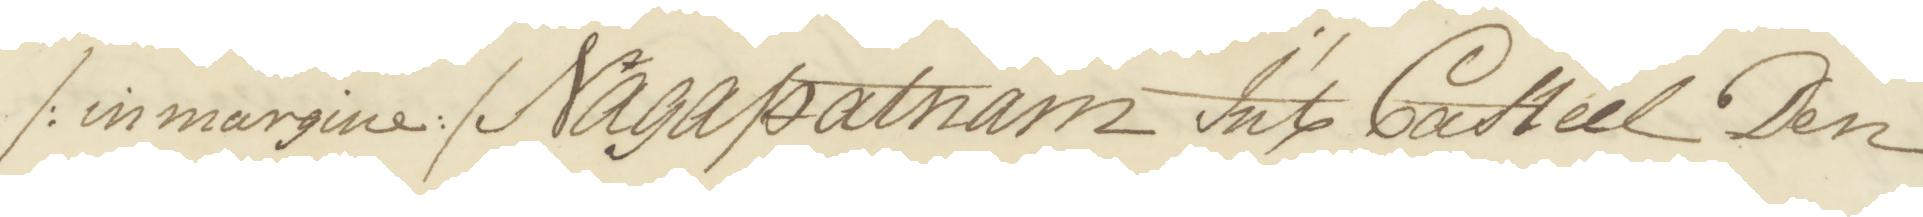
/:in margine:/ Nagapatnam In't Casteel Den
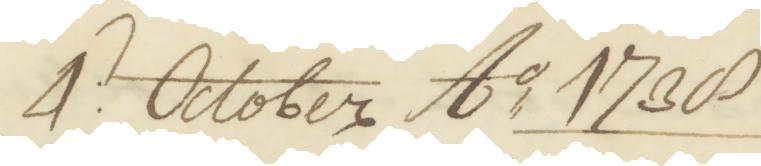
4:' October A„o 1738
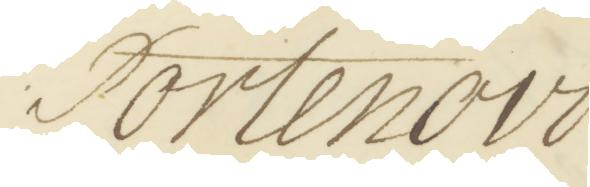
Portenovo
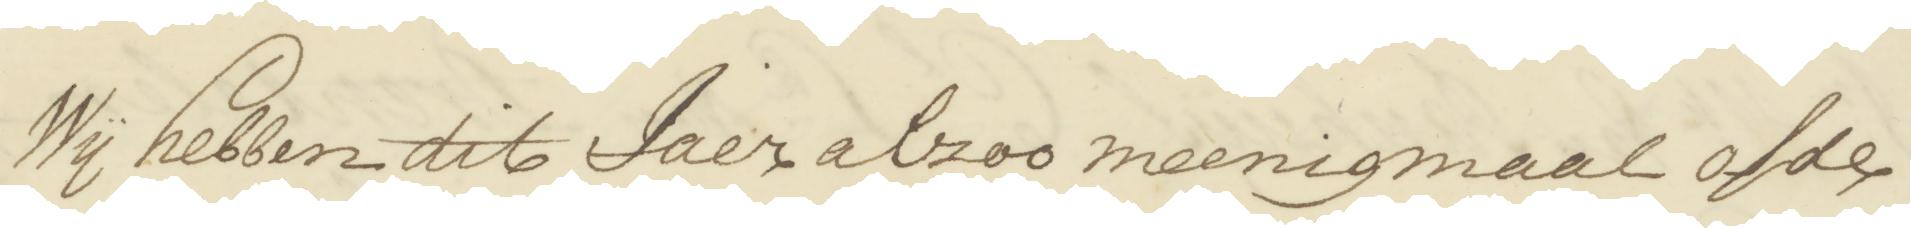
Wij hebben dit Iaer alzoo meenigmaal overde
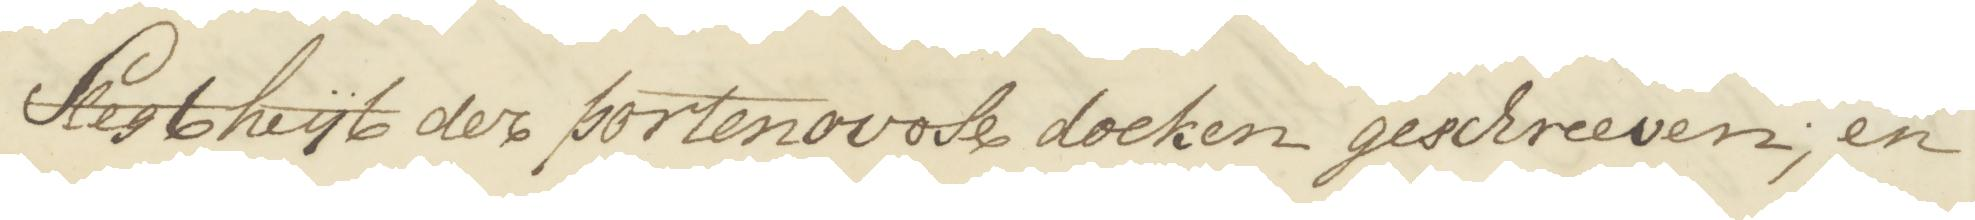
slegtheijt der portenovose doeken geschreeven; en
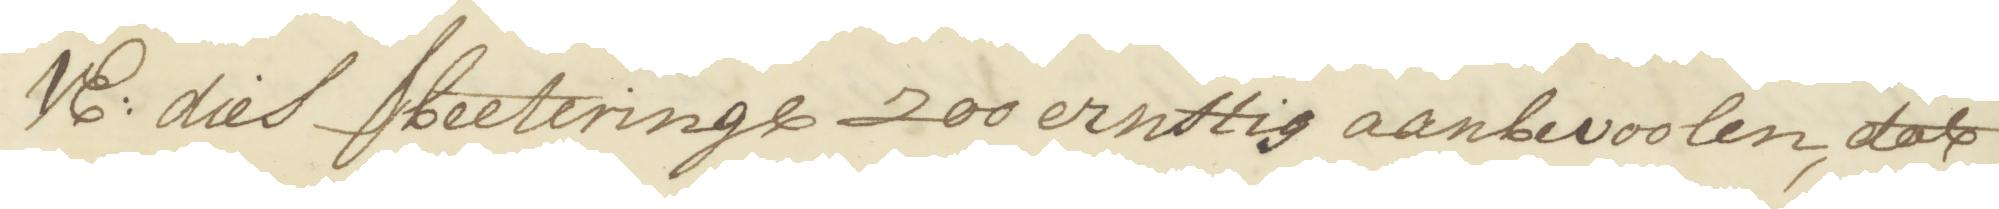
VE: dies verbeeteringe zoo ernstig aanbevoolen, dat
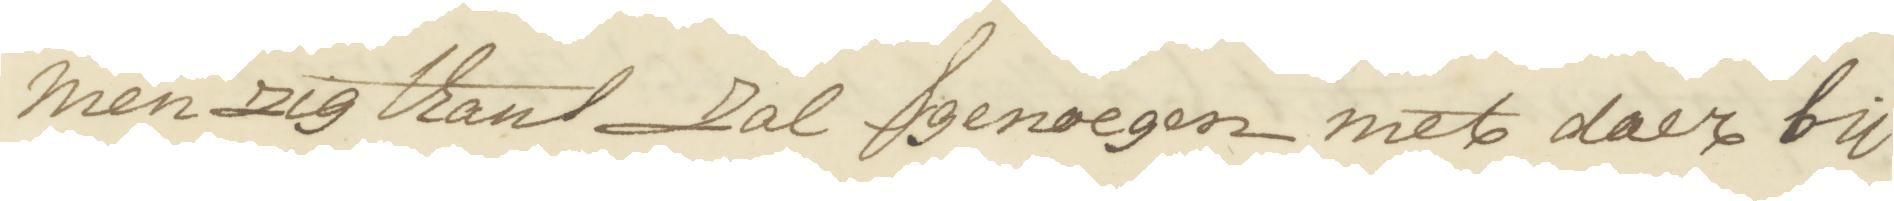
men zig thans zal vergenoegen met daer bij
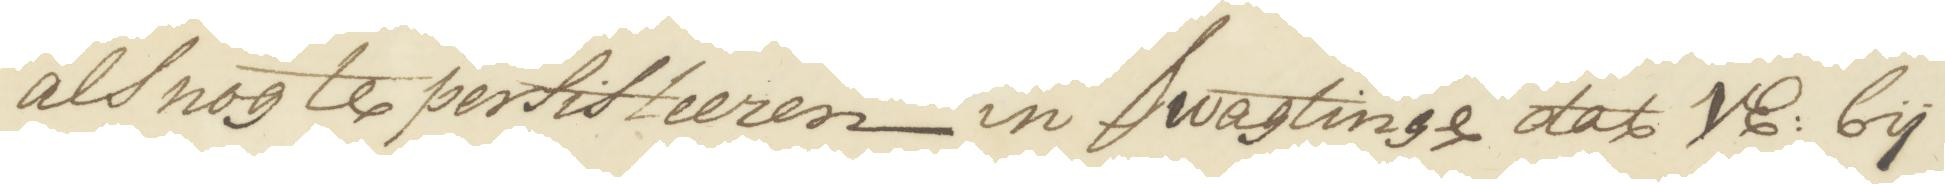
als nog te persisteeren, in verwagtinge dat VE: bij
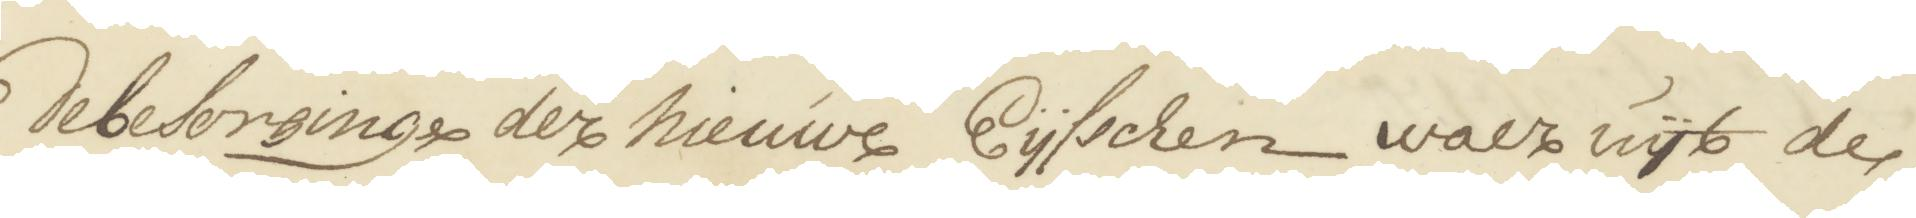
de besorginge der nieuwe Eijsschen waer uijt de
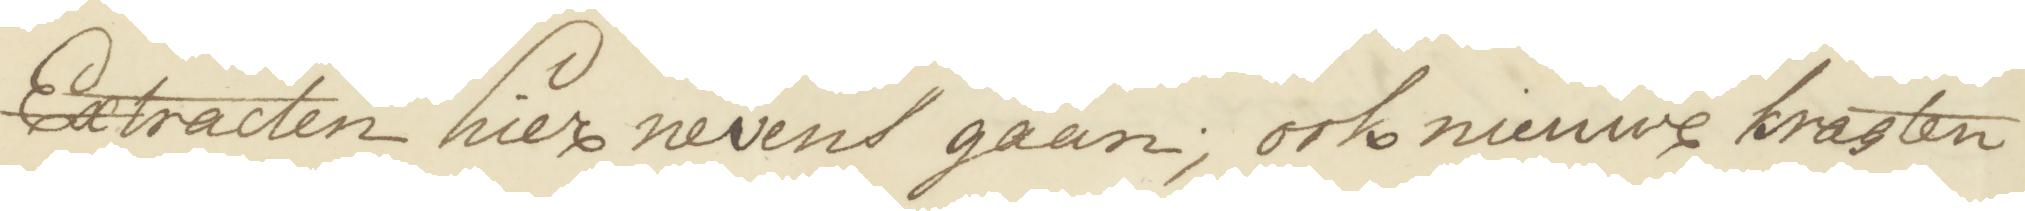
Extracten hier nevens gaan; ook nieuwe kragten
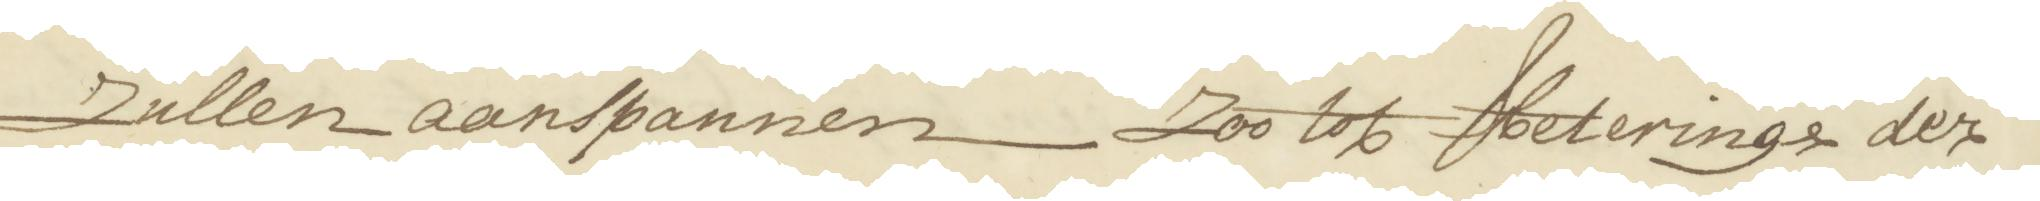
zullen aanspannen zoo tot verbeteringe der
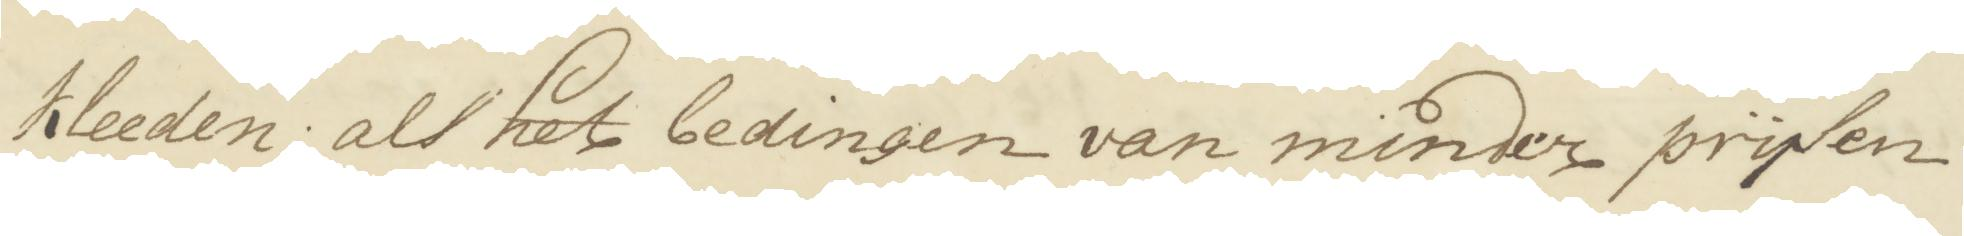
kleeden; als het bedingen van minder prijsen
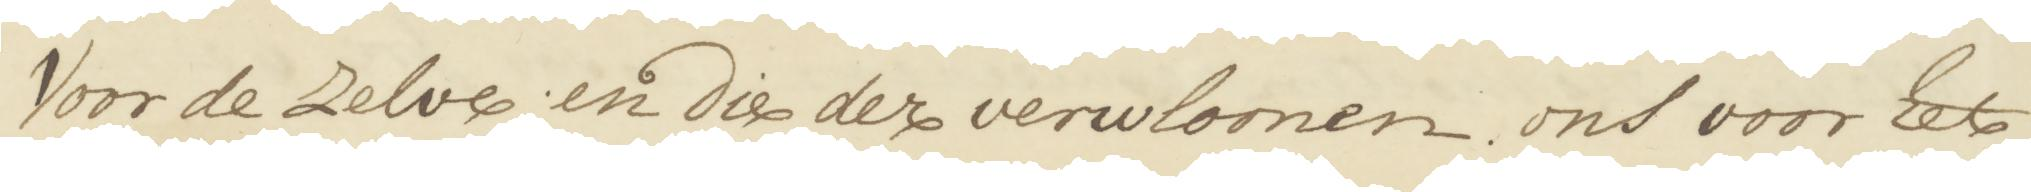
Voor de zelve; en die der verwloonen ons voor het
